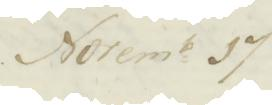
Novem=b 17
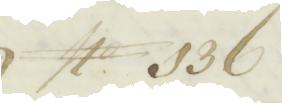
N.o 136
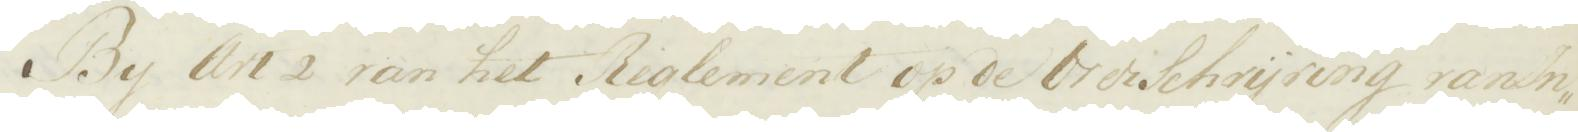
Bij Art 2 van het Reglement op de Overschrijving van In„
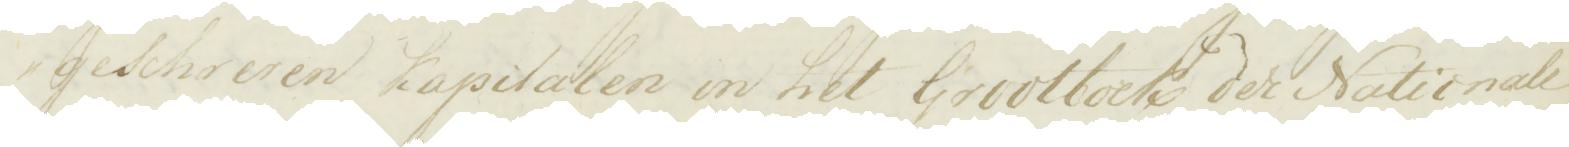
geschreven Kapitalen in het Grootboek der Nationale
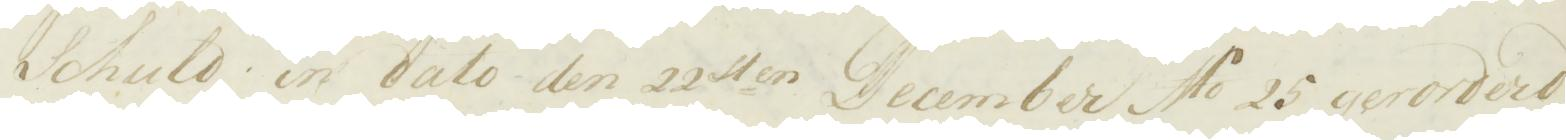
Schuld . in dato den 22=sten December No 25 gevorderd
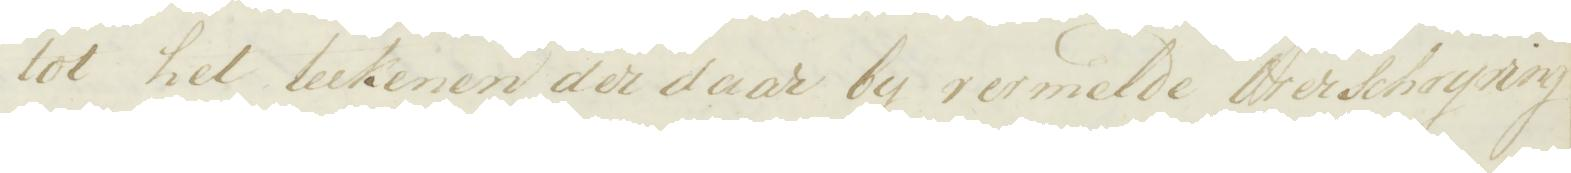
tot het teekenen der daar bij vermelde Overschrijving
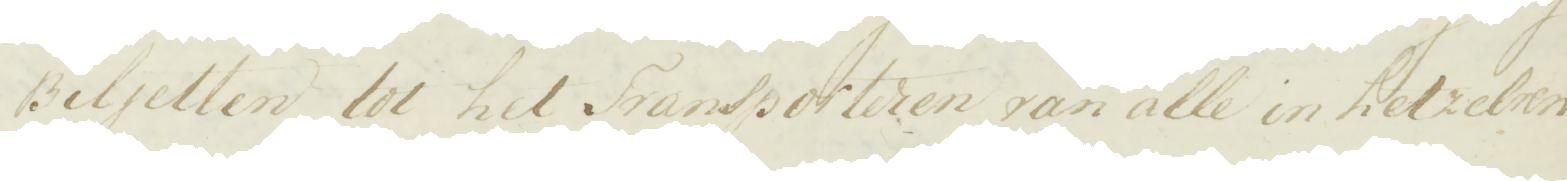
Biljetten tot het Transporteren van alle in hetzelven
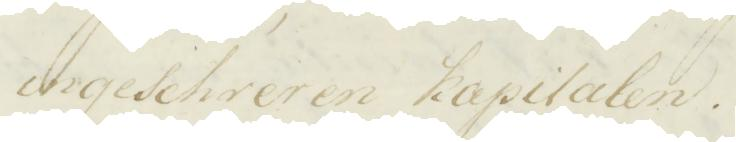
ingeschreven Kapitalen.
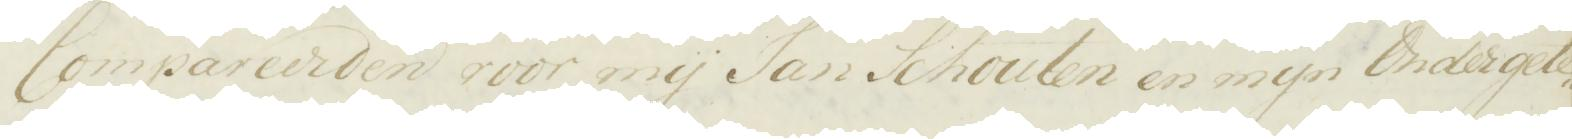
Compareerden voor mij Jan Schouten en myn Ondergete„
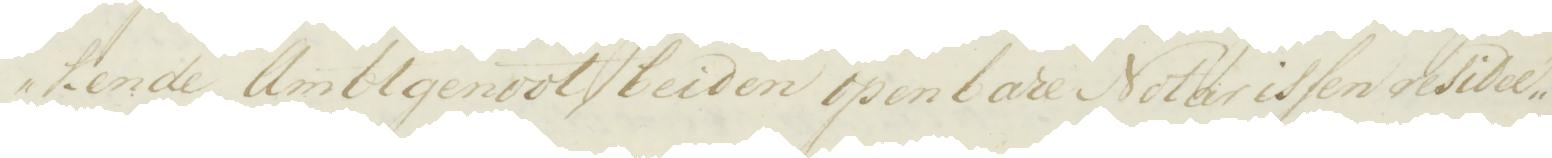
„kende Ambtgenoot beiden openbare Notarissen residee„
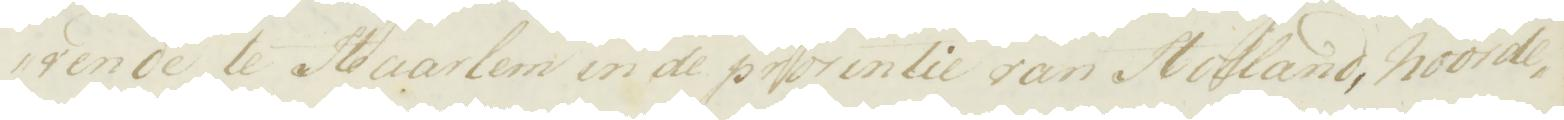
„rende te Haarlem in de provintie van Holland, Noorde„
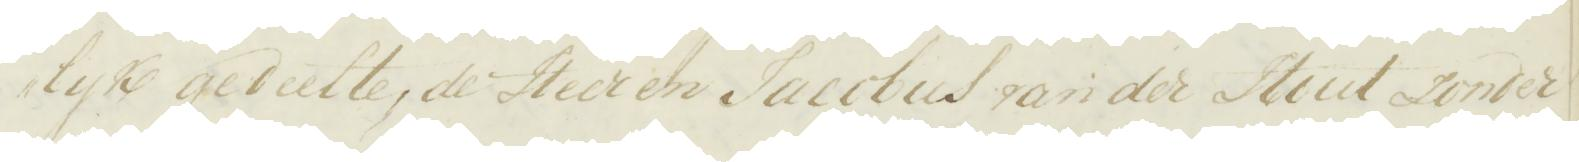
„lijk gedeelte, de Heeren Jacobus van der Hout zonder
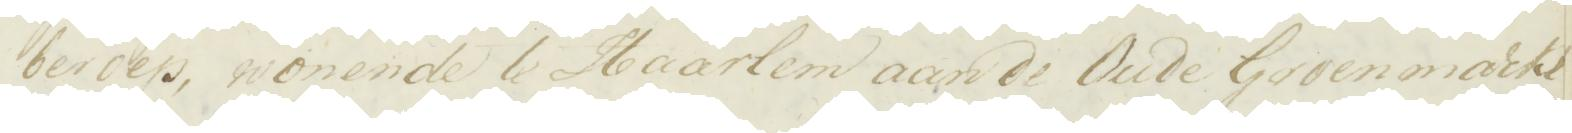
beroep, wonende te Haarlem aan de Oude Groenmarkt
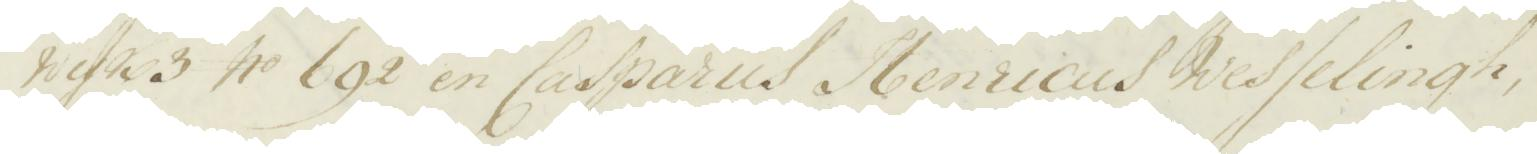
wijk 3 no 692 en Casparus Henricus Wesselingh,
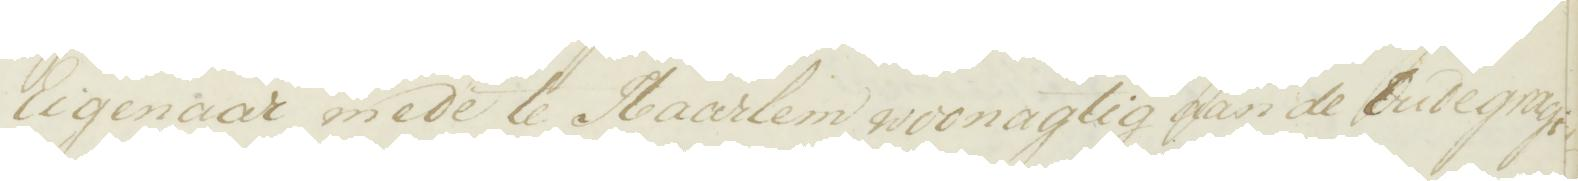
Eigenaar mede te Haarlem woonagtig aan de Oudegragt
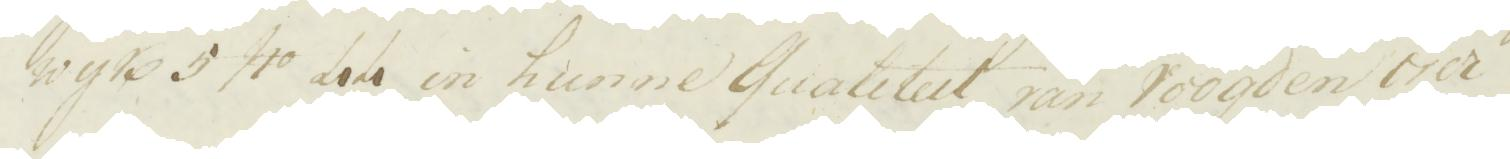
wijk 5 n-o 44 in hunne Qualiteit van Voogden over
